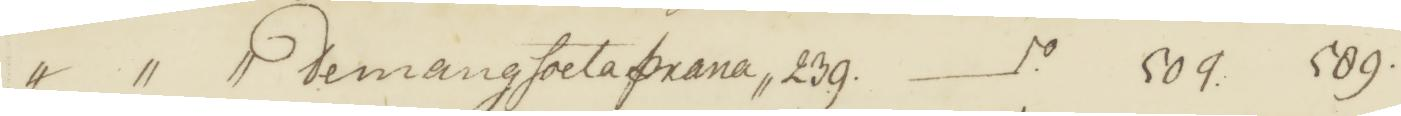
„ „ „ demangsoeta prana „ 239. _.o 504. 589.
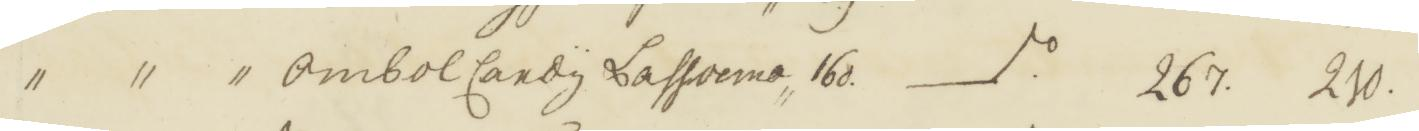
„ „ „ ombol Cardij Lassoemo „ 160. _.o 267. 210.
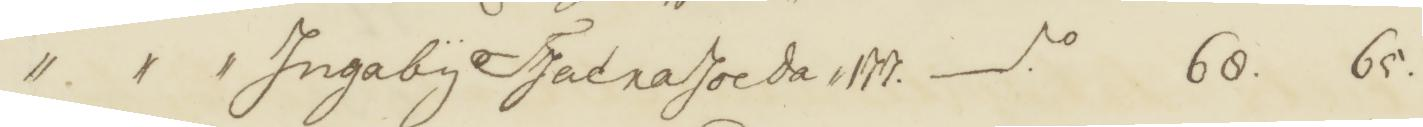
„ „ „ Jngabij Tjacrajoeda „ 177. _.o 68. 65
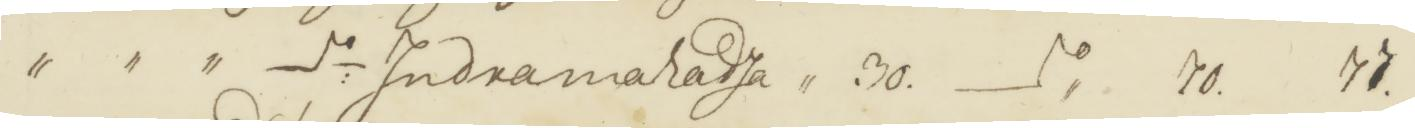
„ „ „ _:o Jndramahadja „ 30. _„o 70. 77.
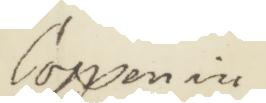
Coppen in
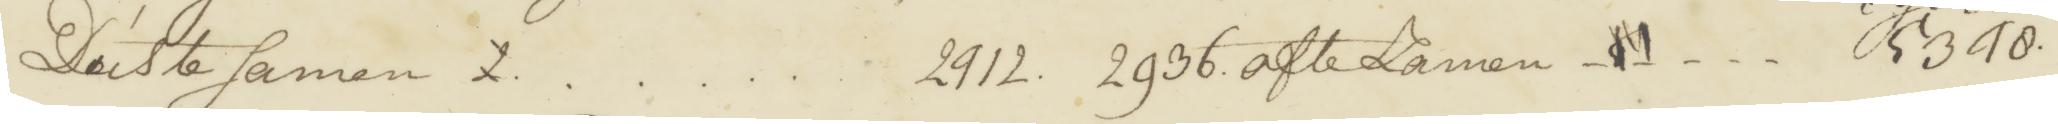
Dus te samen 2 . . . . . . 2912. 2936. oftezamen -5 - - - - 5348.
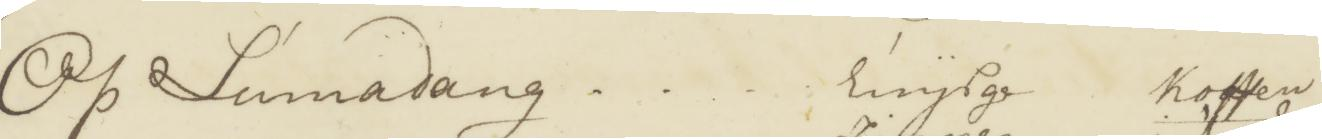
Op Sumadang . . . . . huijsge koppen
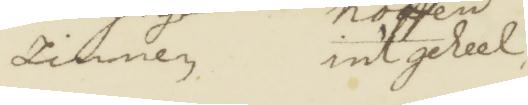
zinnen in't geheel
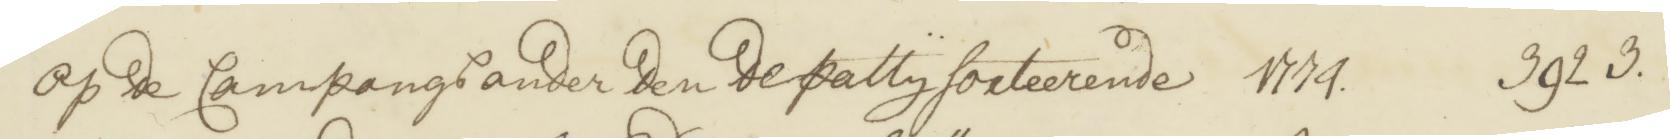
op de Campongs onder den de pattij sorteerende 1774. 3923.
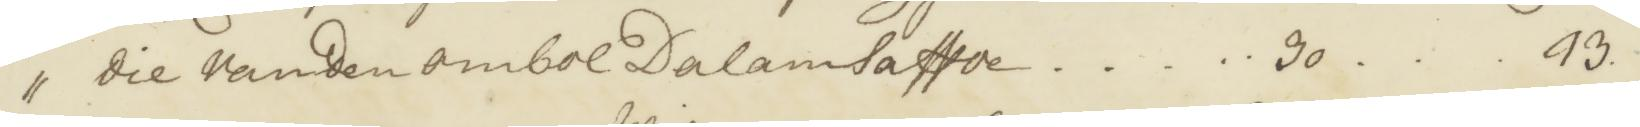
„ die vanden ombol Dalamsappoe . . . . . 30 . . . 43.
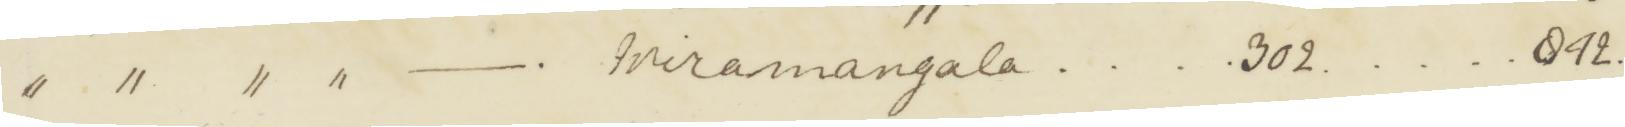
„ „ „ „ —. wiramangala . . . . 302. . . . . 842.
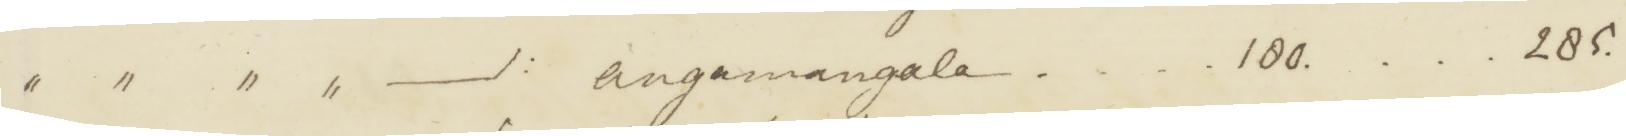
„ „ „ „ _: angamangala . . . .180. . . . 285.
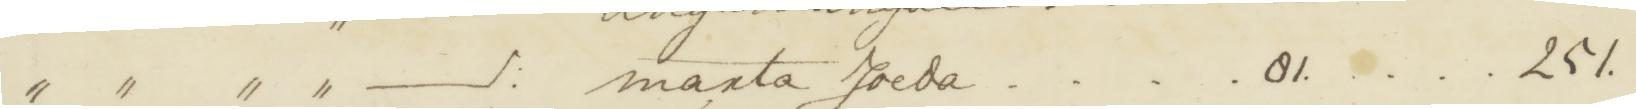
„ „ „ „ _: marta Joeda . . . . 81. . . . . 251.
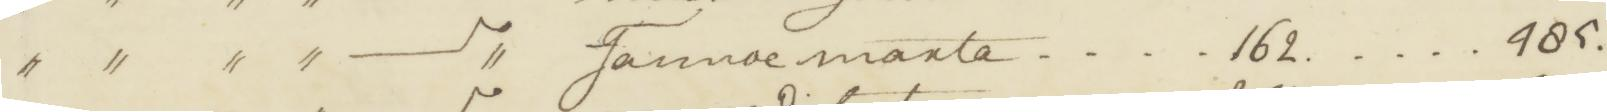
„ „ „ „ _„o Tannoe marta . . . . 162. . . . . 485.
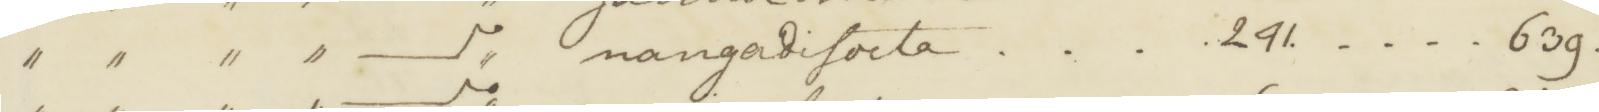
„ „ „ „ _„o nangadisoeta . . . . 241. . . . . 639
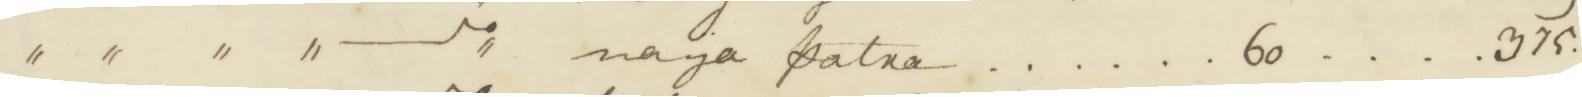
„ „ „ „ _„o naija patra . . . . . . 60 . . . . 375
